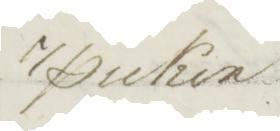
7 pieken
